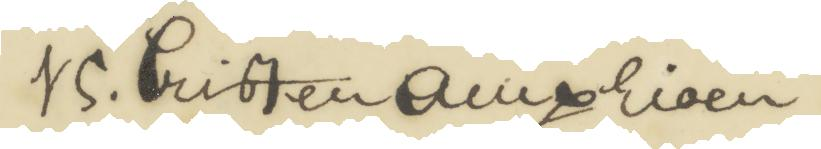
15. kisten Amphioen
